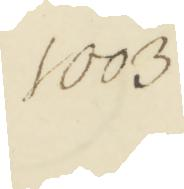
1003
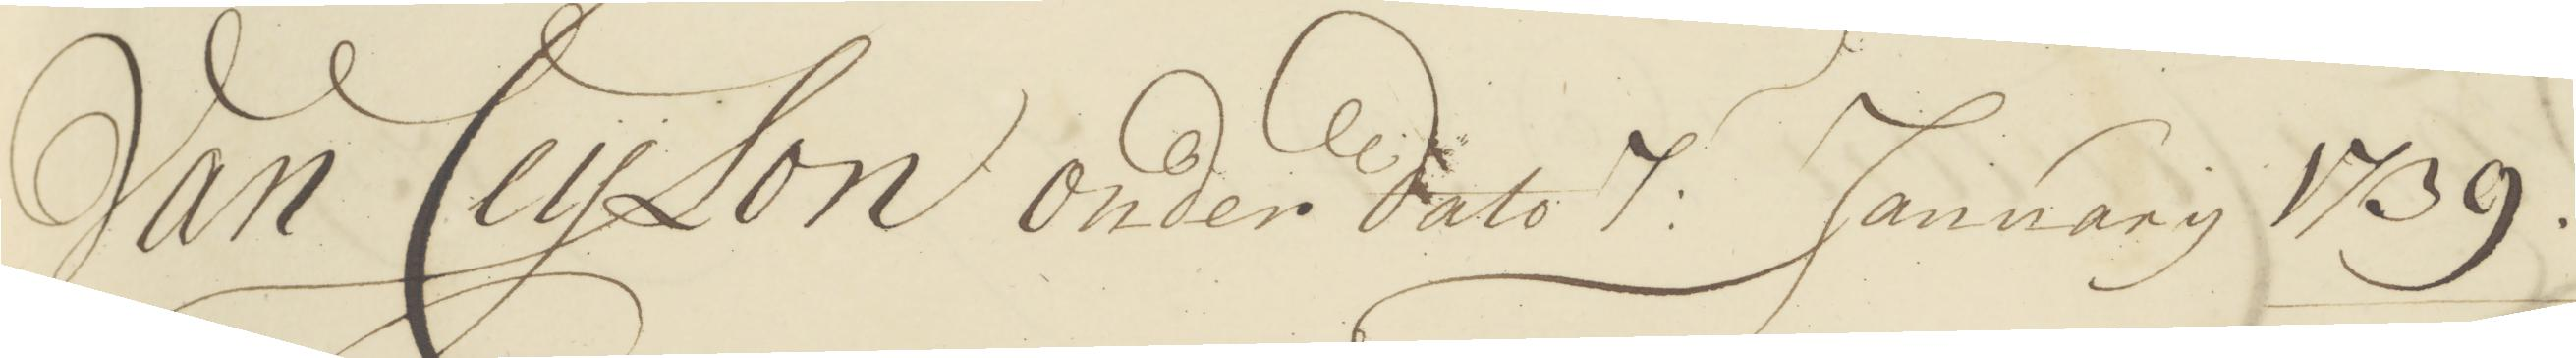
Van Ceijlon onder dato 7:' Januarij 1739.
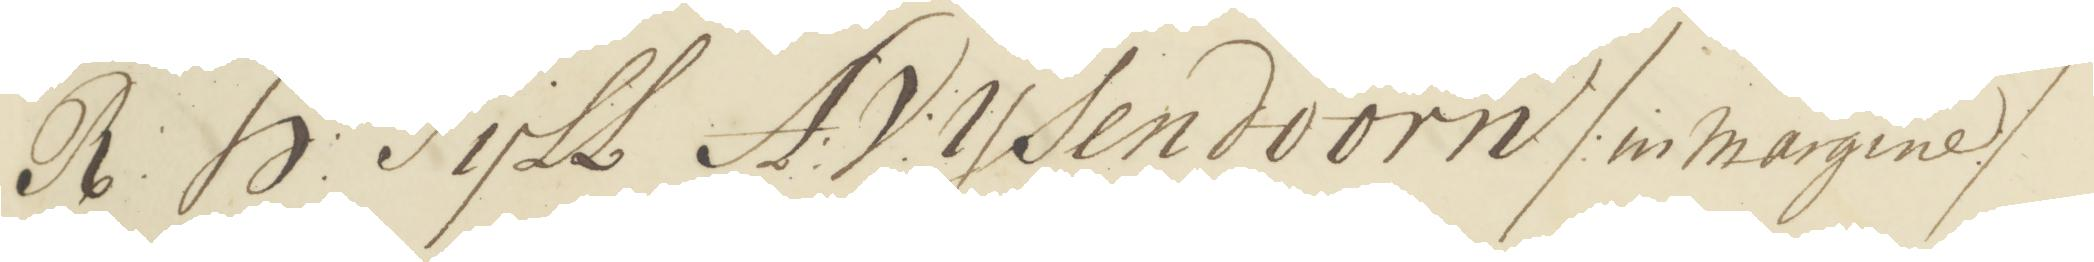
R: H: Pijll A: V: Ysendoorn /:in margine:/
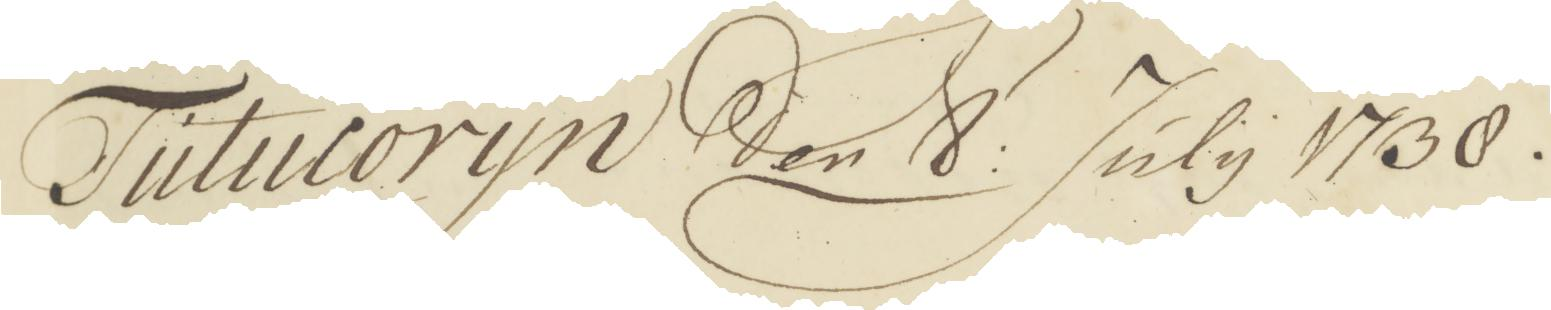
Tutucorijn den 8:' Julij 1738.
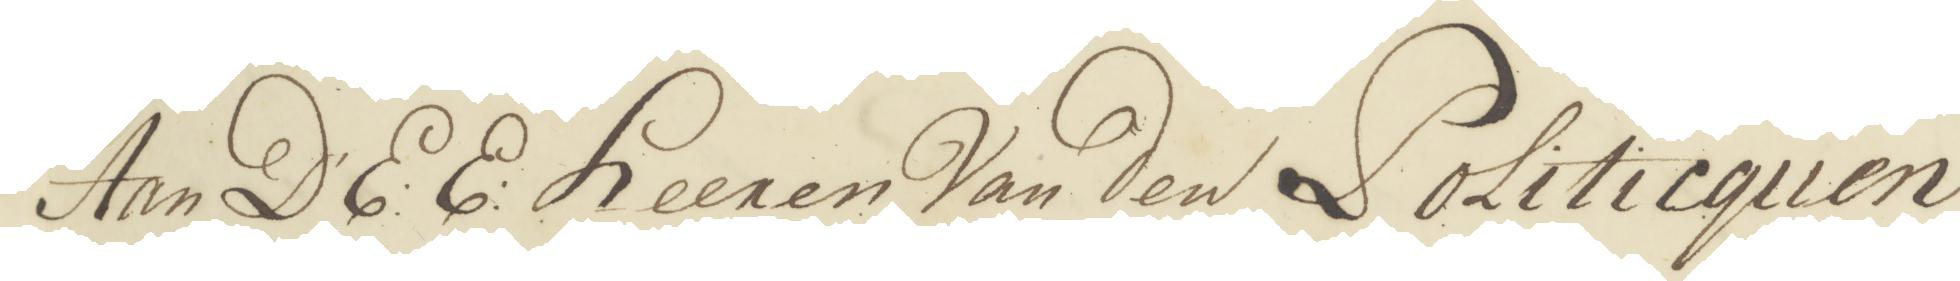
Aan D E: E: Heeren Van den Politicquen
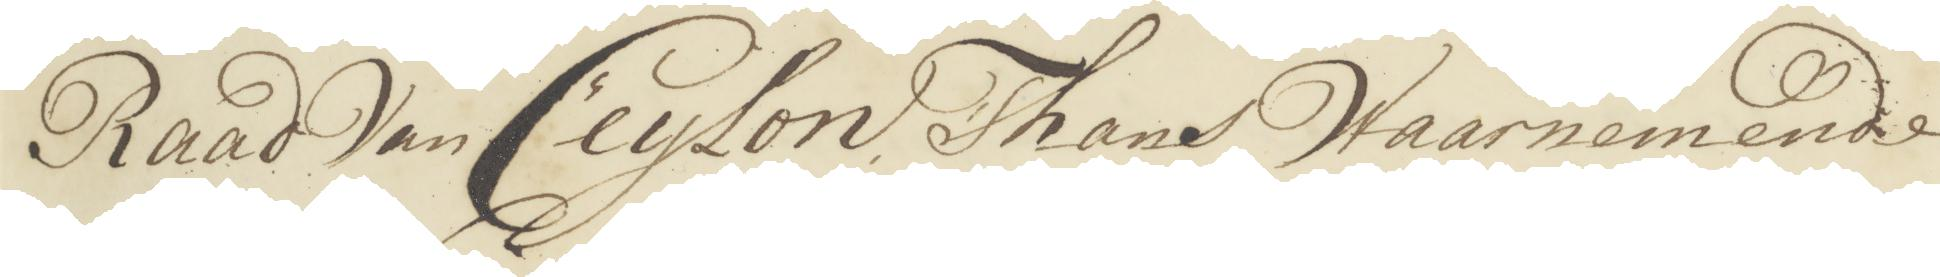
Raad Van Ceylon, Thans Waarnemende
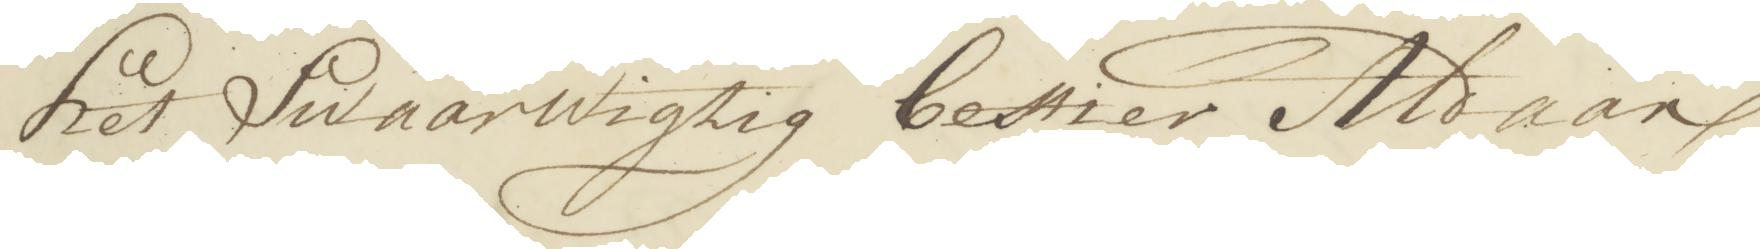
het Swaarwigtig bestier Aldaar
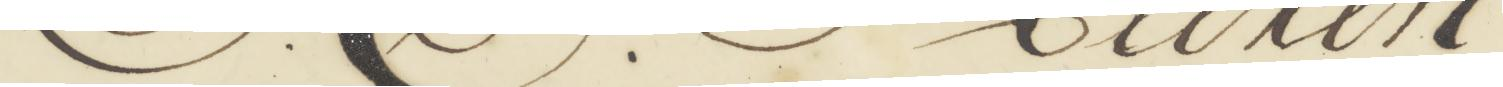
E: E: Heeren
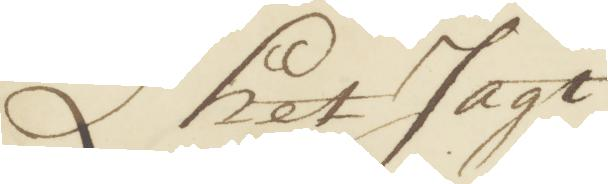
P„r het Jagt
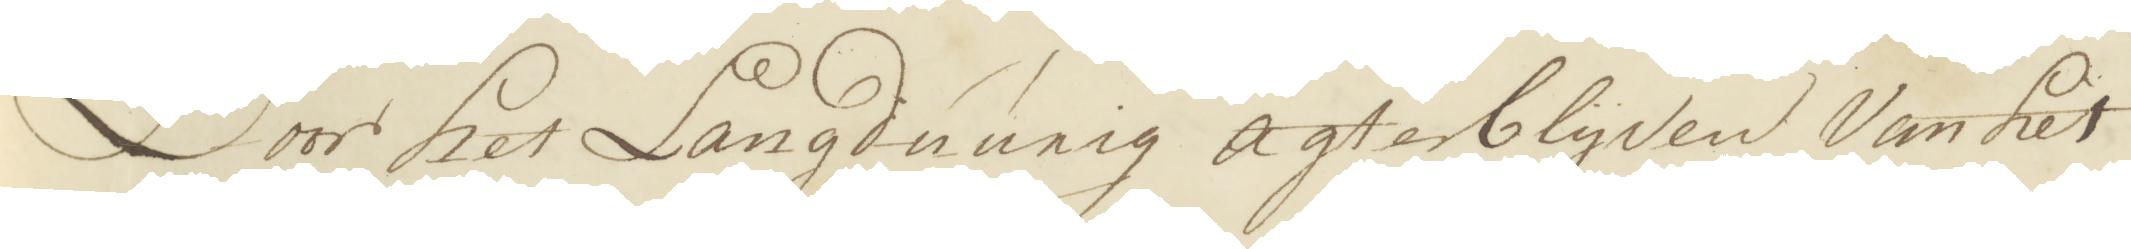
Door het Langduurig agterblijven Van het
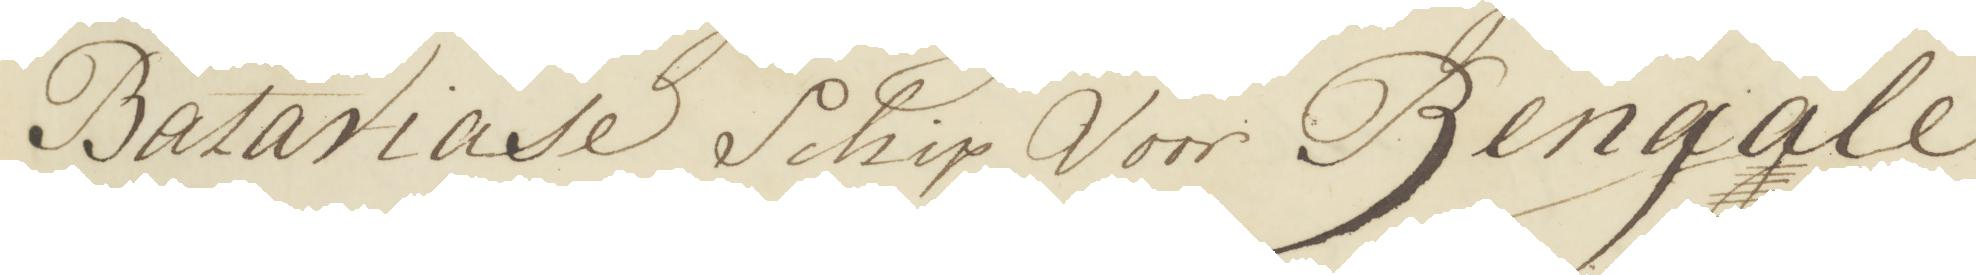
Bataviase schip Voor Bengale
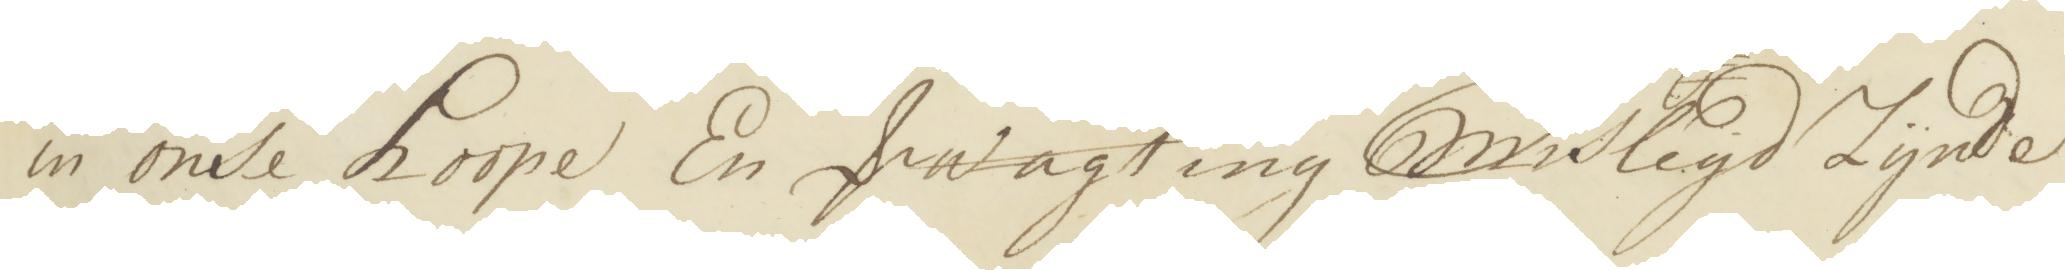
in onse Hoope En verwagting misleijd zijnde
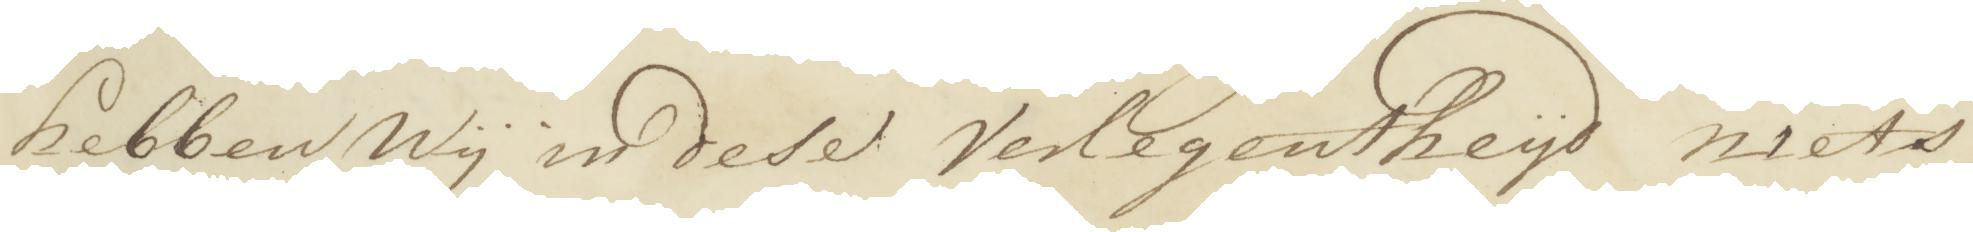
hebben Wij in dese Verlegentheijd niets
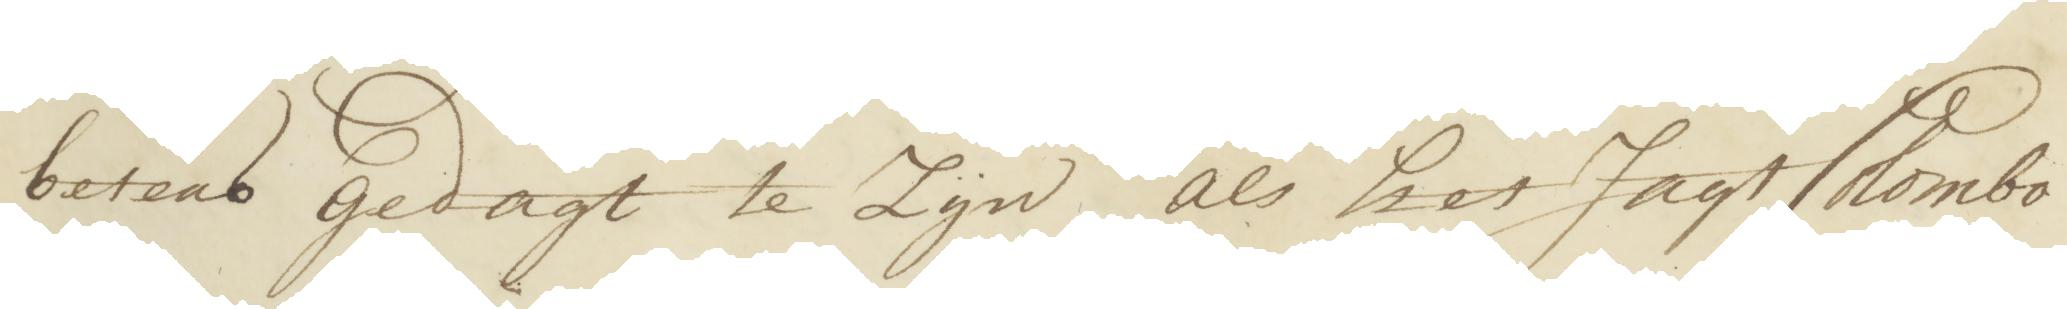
beters gedagt te zijn, als het Jagt Colombo
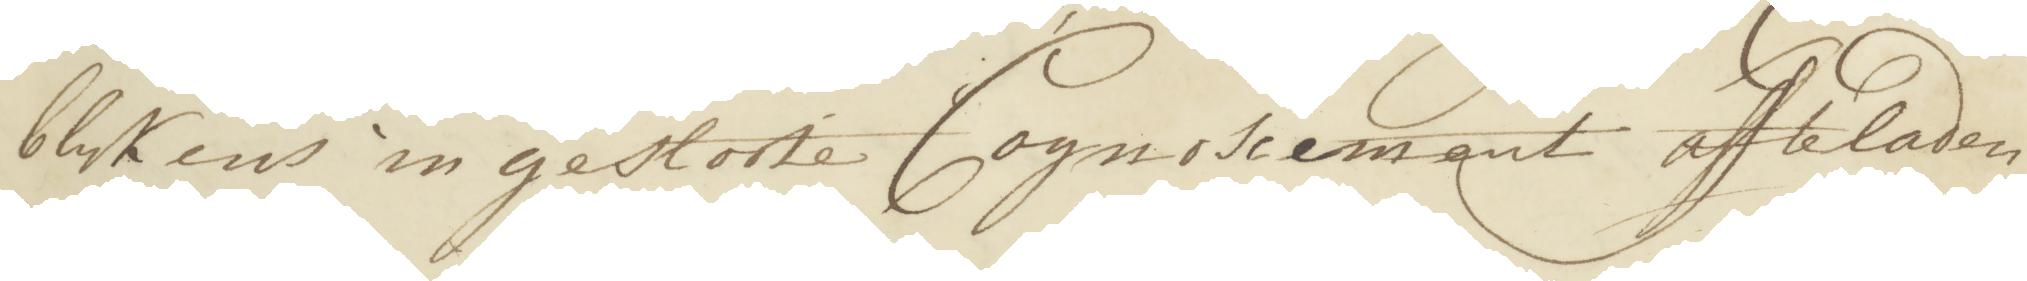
blykens in gesloote Cognoscement affteladen,
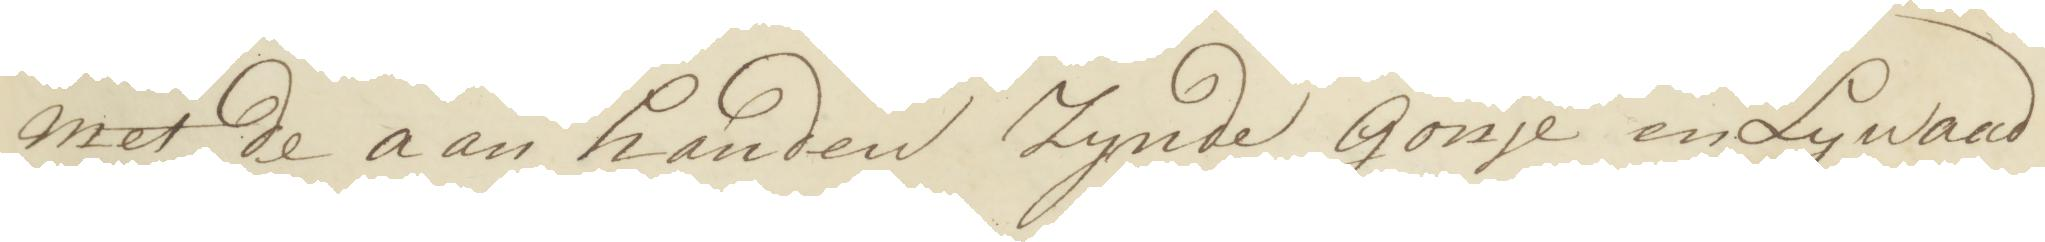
met de aan handen zynde Gonje en Lywaad
